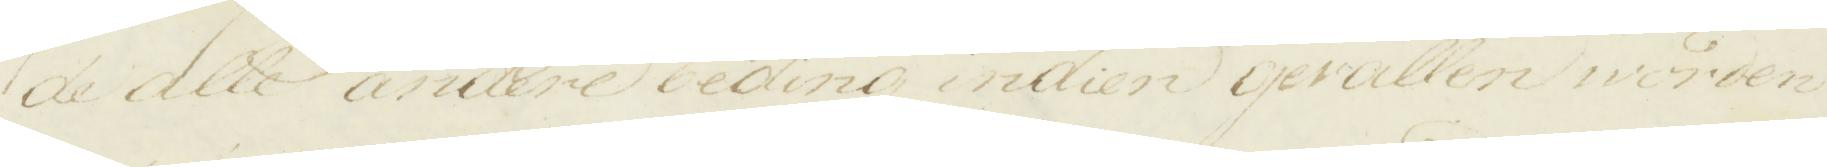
de alle andere beding indien gevallen worden
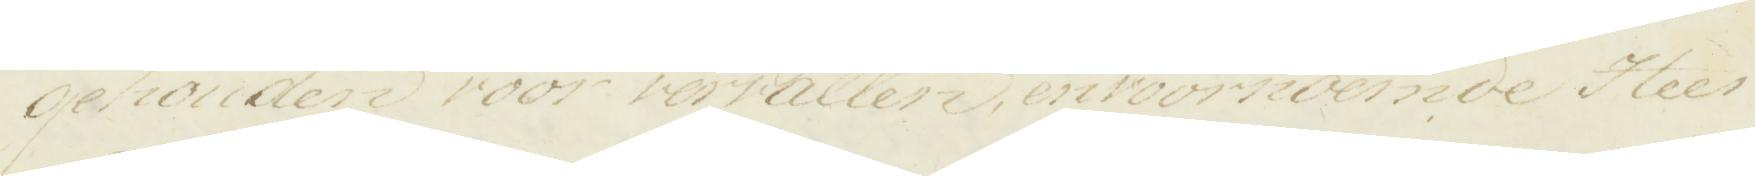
gehouden voor vervallen, en voornoemde Heer
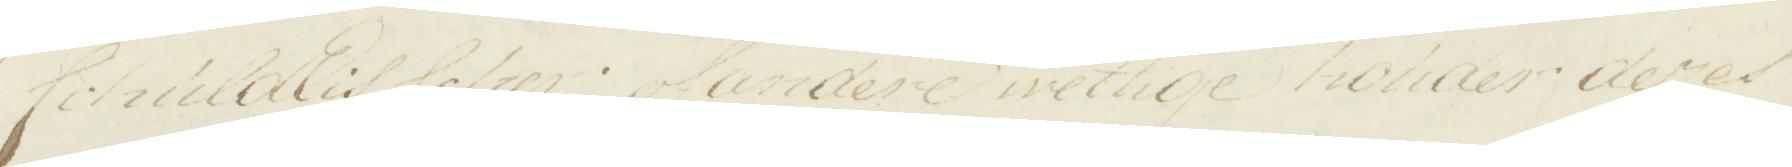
schuld Eisscher of andere wettige houder dezes
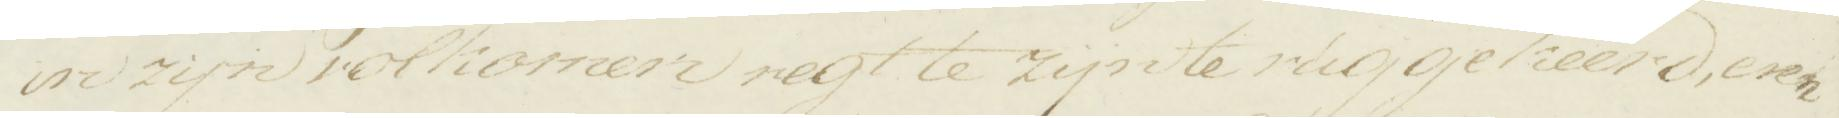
in zijn volkomen regt te zijn teruggekeerd, even
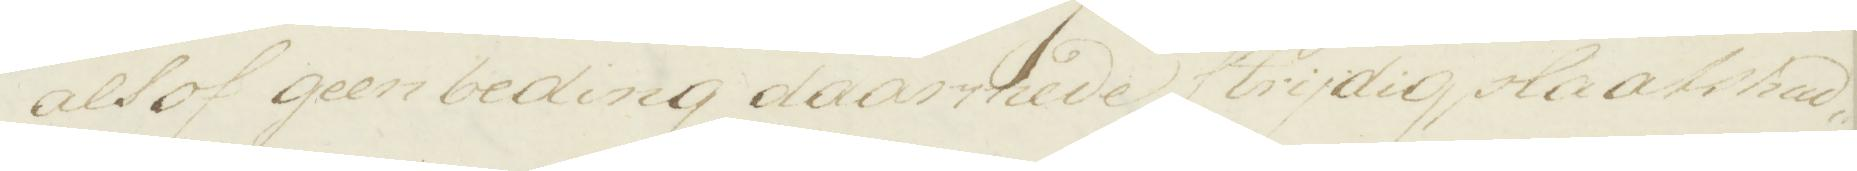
als of geen beding daarmede strijdig, plaatshad„
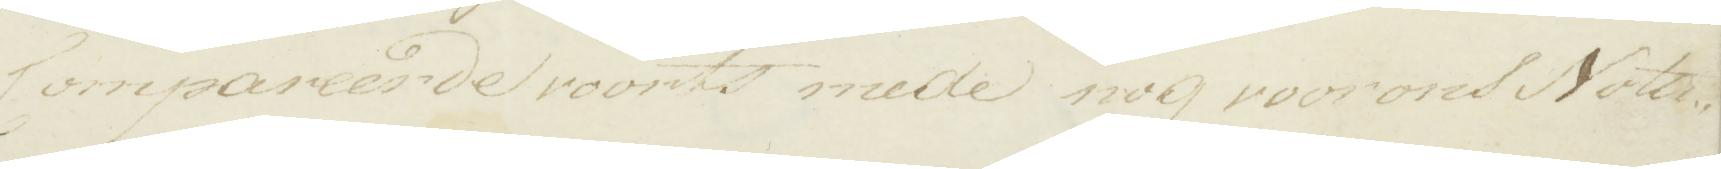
Compareerde voorts mede nog voor ons Nota„
